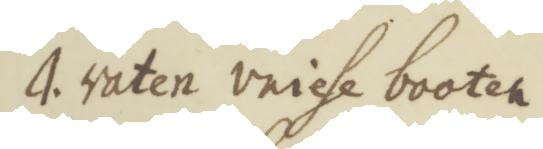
4. vaten vriese booter
